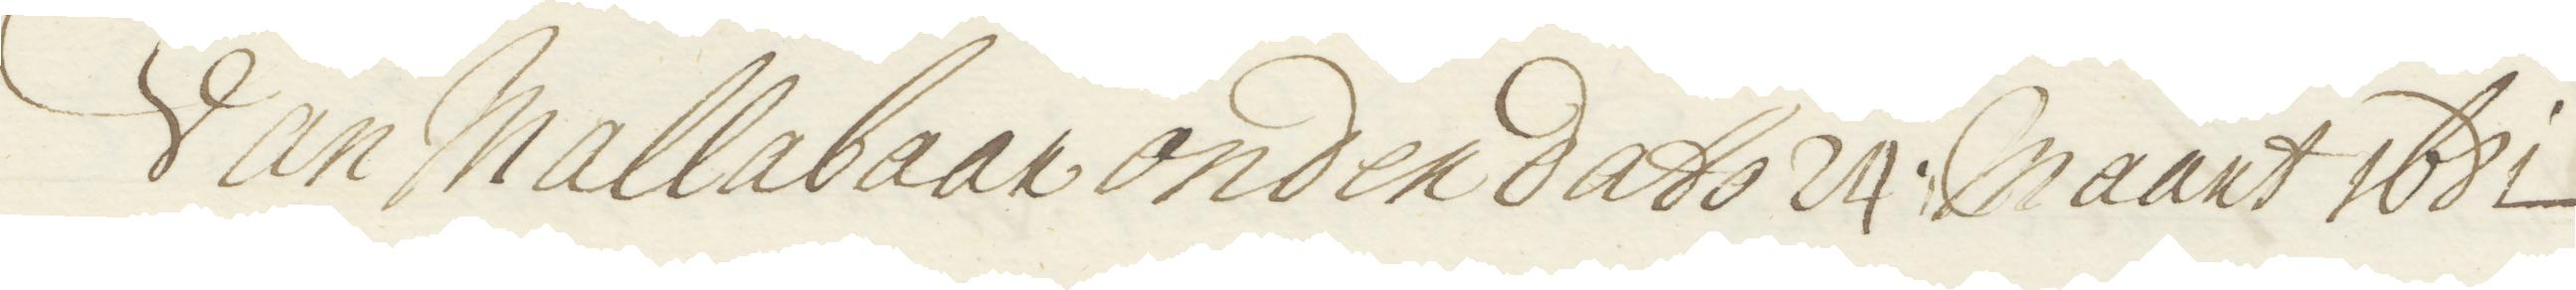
Van Mallabaar onder dato 24:' Maart 1681
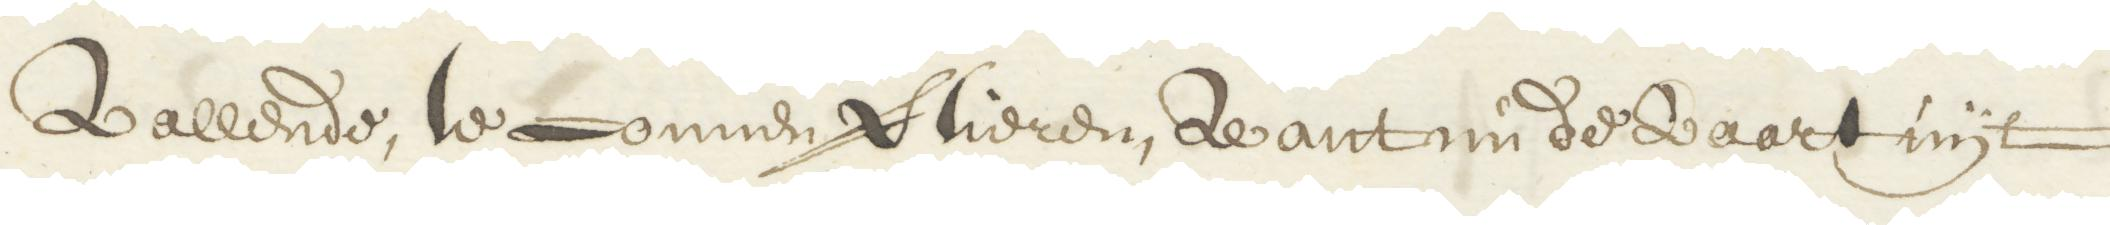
vallende, te connen vertieren, want nu de vaart uijt
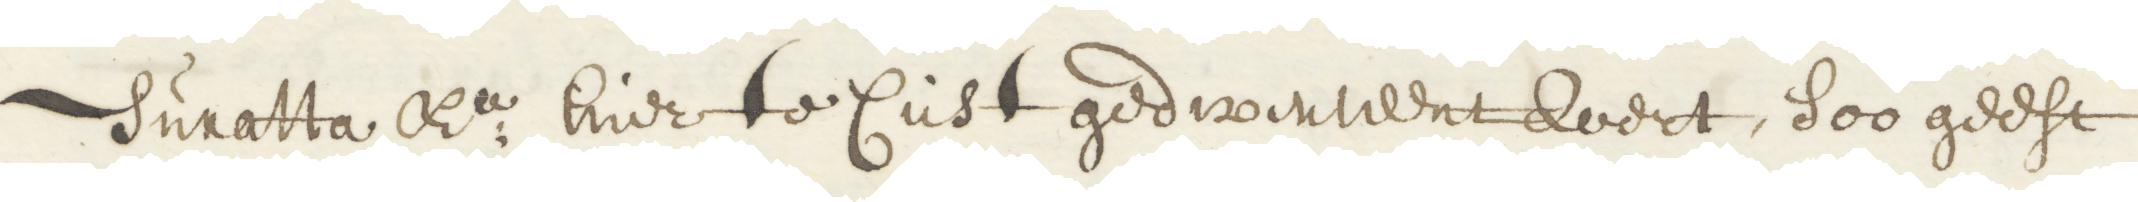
suratta &:a hier te Cust gediverteert voert, soo geeft
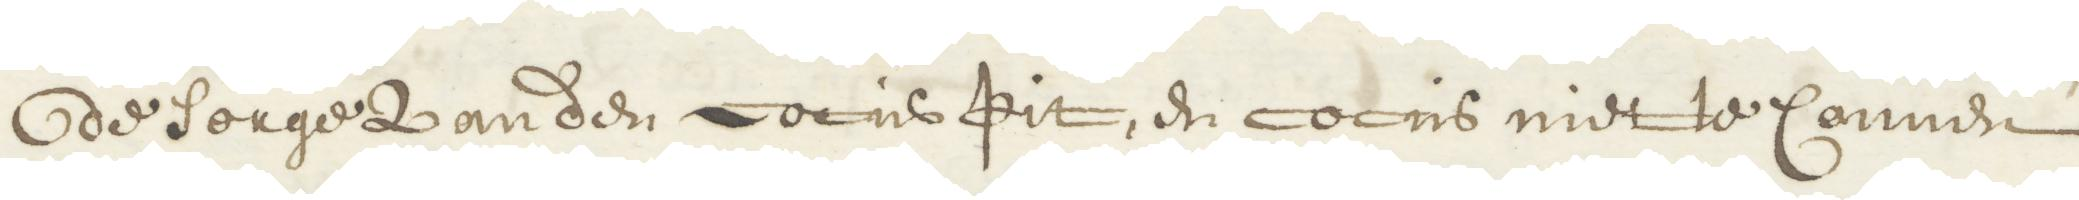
de sorge van den cocus pit, en cocus niet te Connen
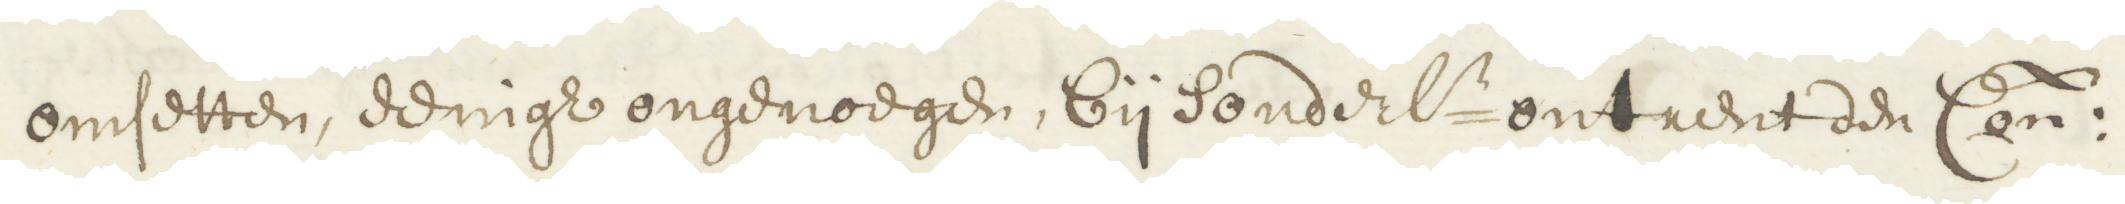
omsetten, eenigh ongenoegen, bij sonderl=k ontrent den Con:
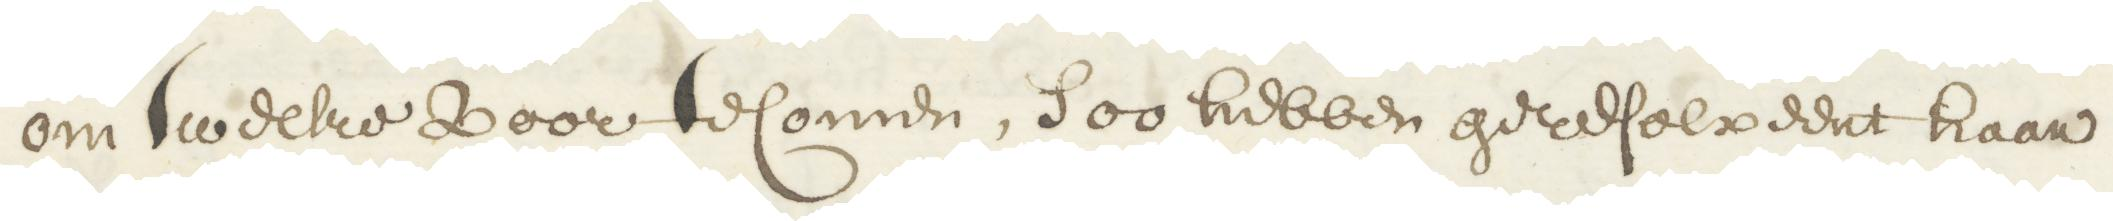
om twelke voor te comen, soo hebben geresolveert haar
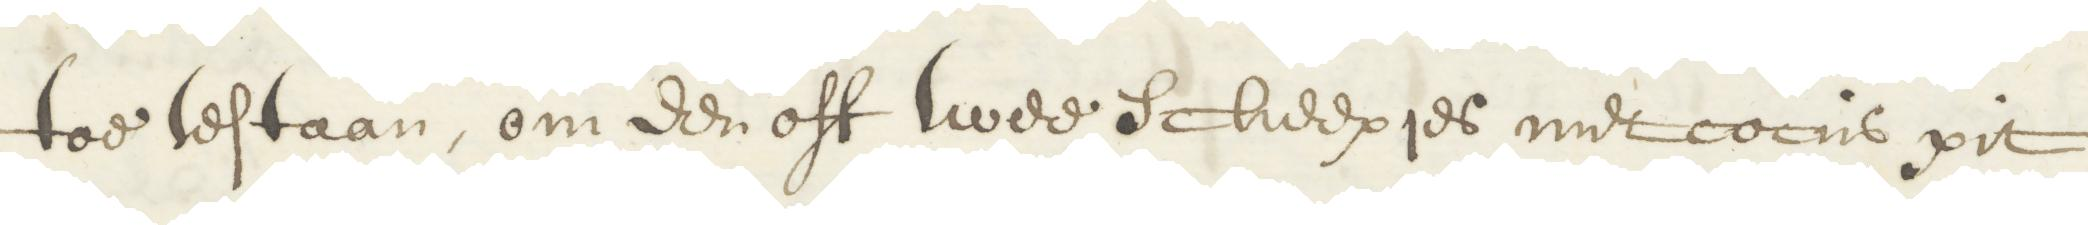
toe testaan, om een off twee scheepjes met cocus pit
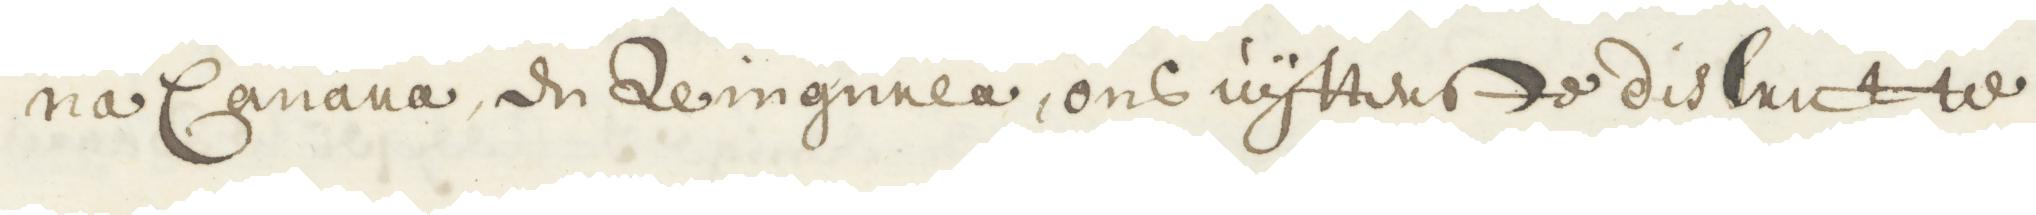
na Canara, en wingurla, ons uijtterste district te
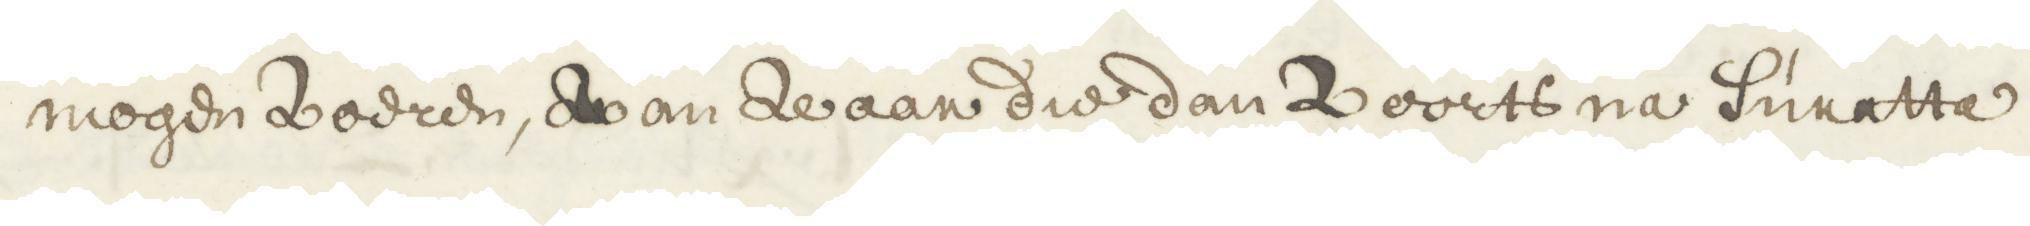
mogen voeren, van waar die dan voorts na suratta
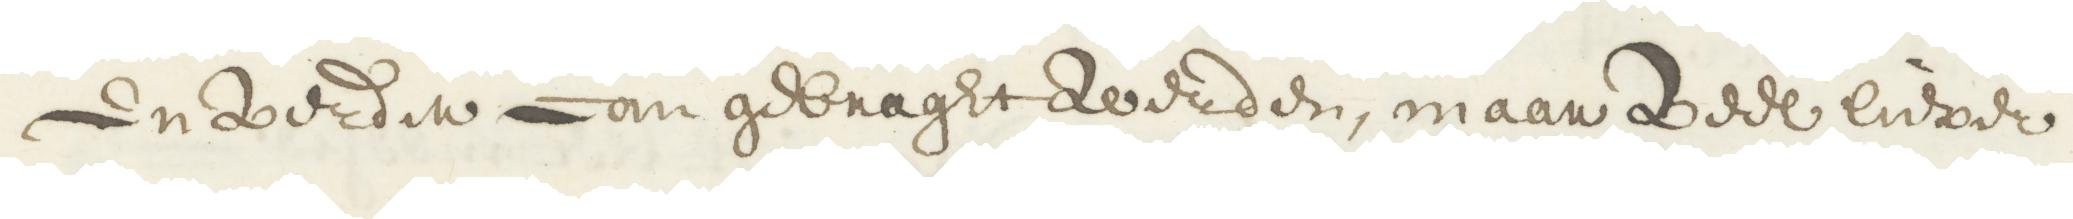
En verder can gebraght werden, maar veel liever
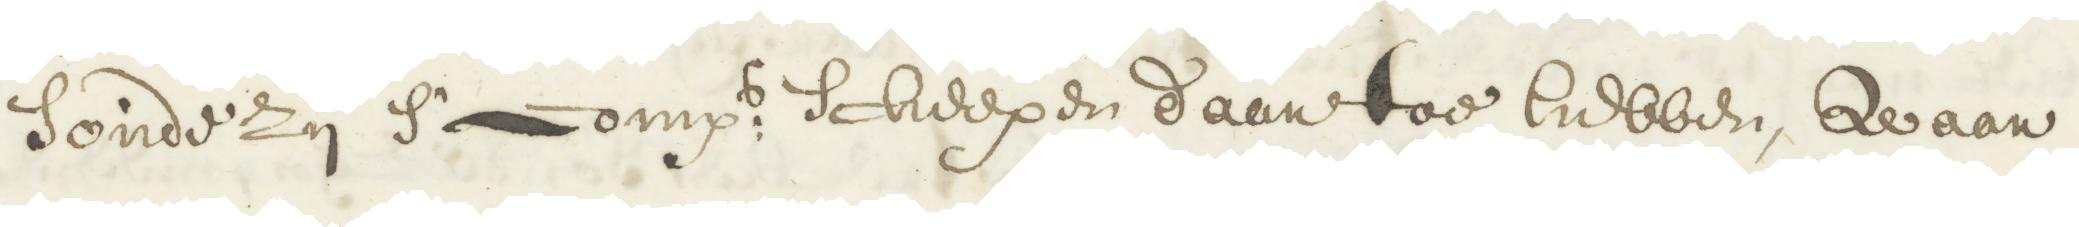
soude zij ’s comp:s scheepen daar toe hebben, waar
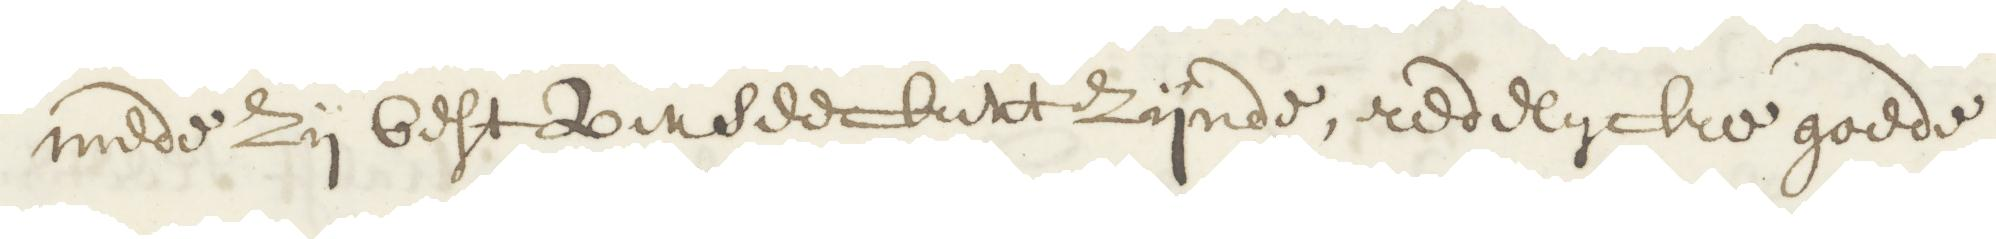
mede zij best verseeckert zijnde, redelycke goede
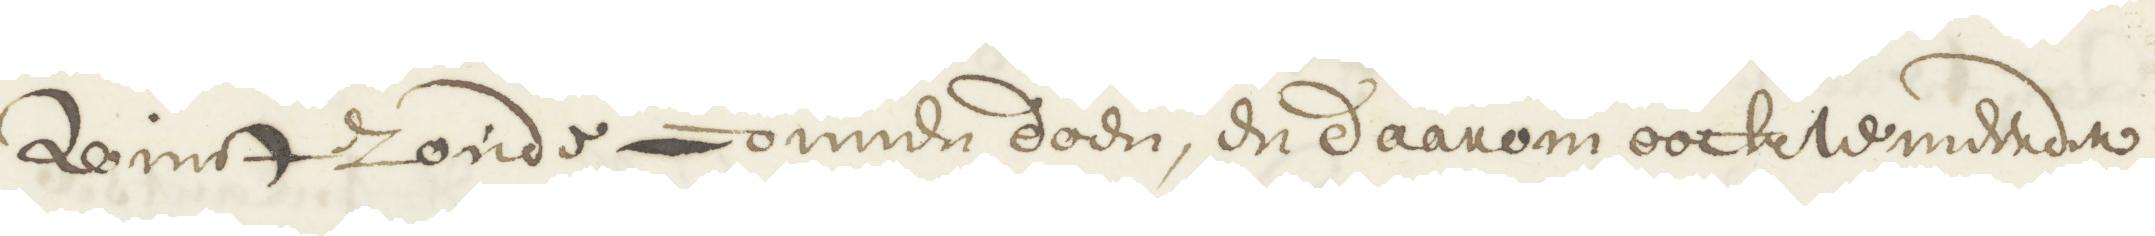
winst zoude connen doen, en daarom oock te meerder
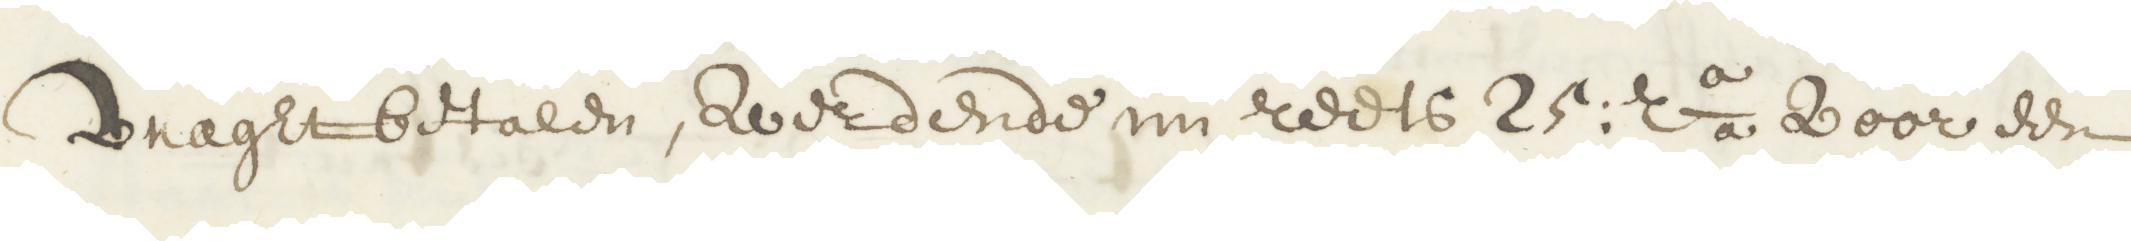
vraght betalen, werdende nu reets 25: ro/a voor een
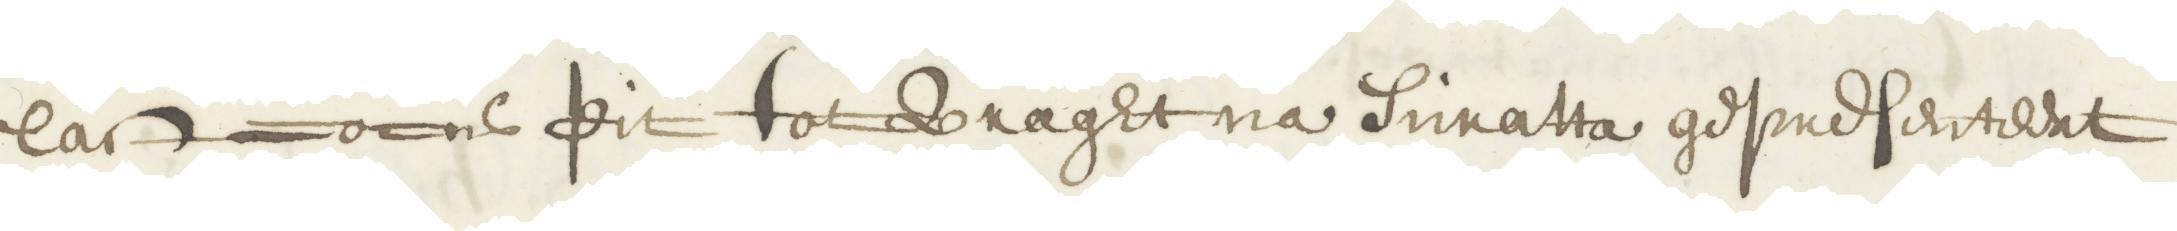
last cocus pit tot vraght na suratta gepresenteert
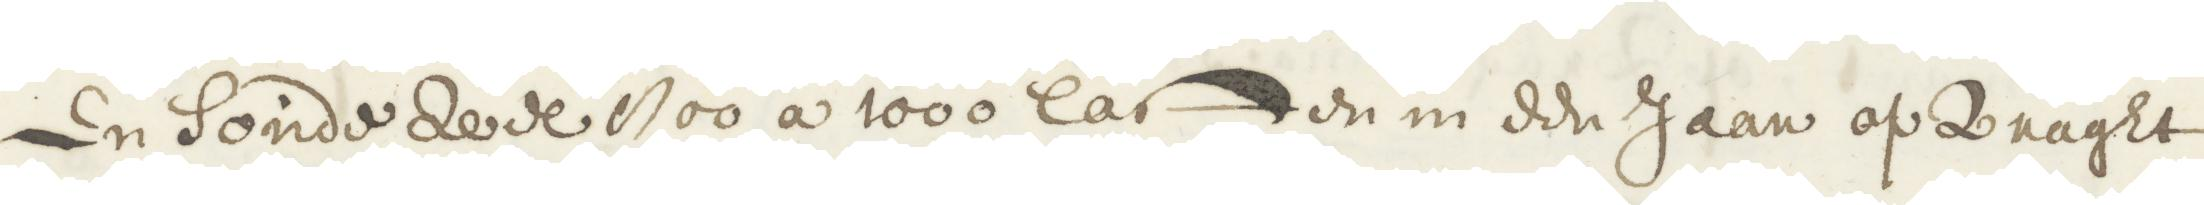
En soude wel 800 a 1000 lasten in een Jaar op vraght
